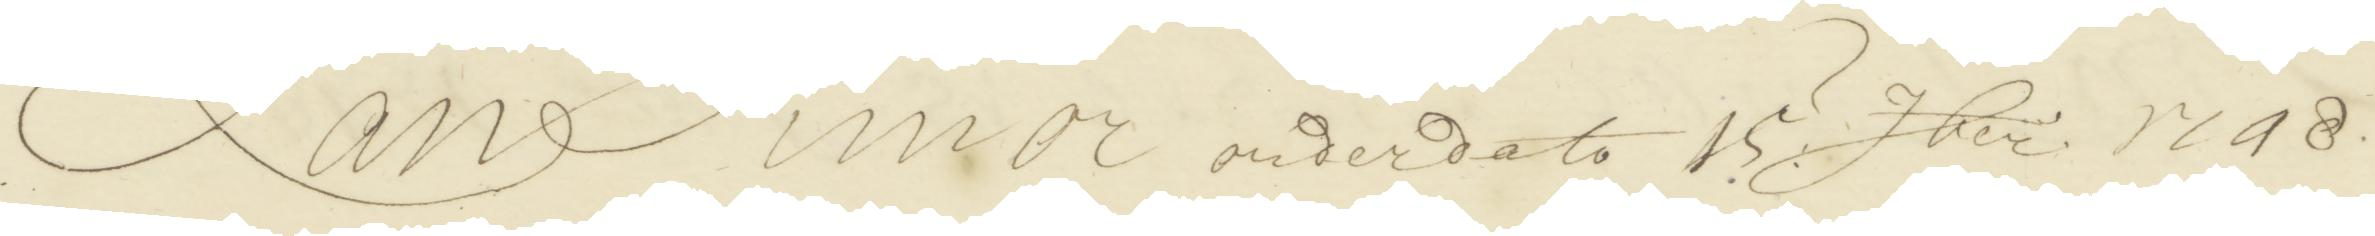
Van Timor onder dato 15:' Jber: 1748
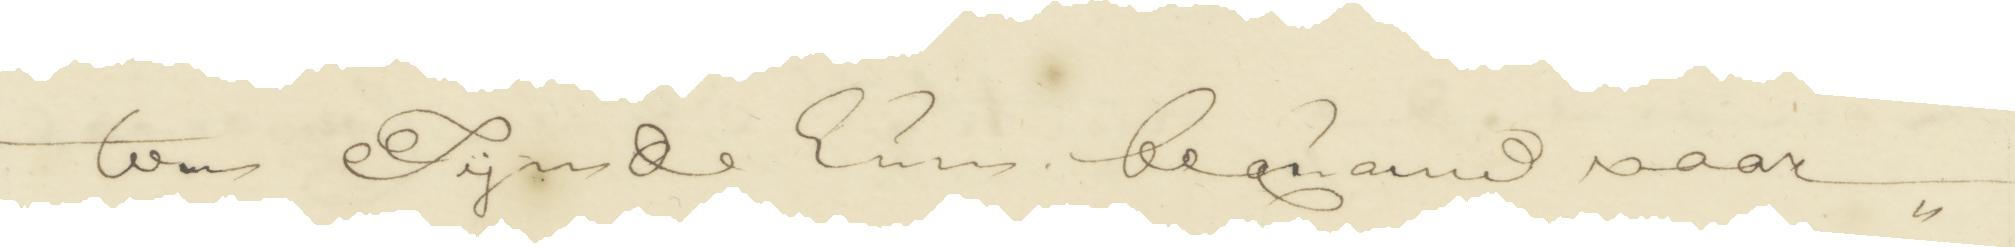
ten Eijnde hun bequame vaar „
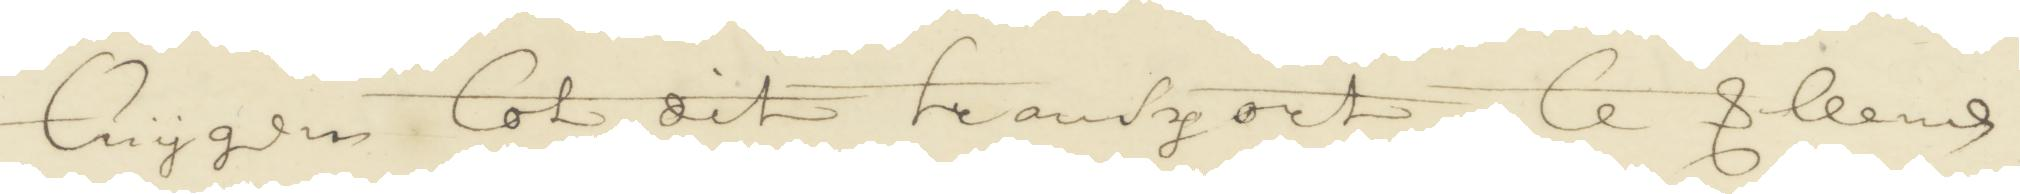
tuijgen tot dit transport te verleenen
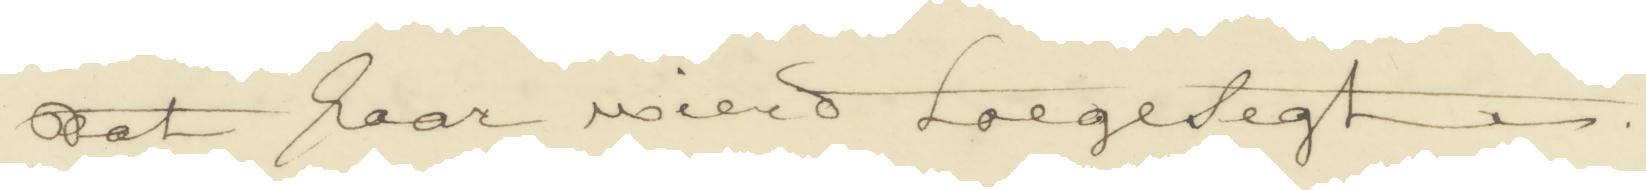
dat haar wierd toegesegt.
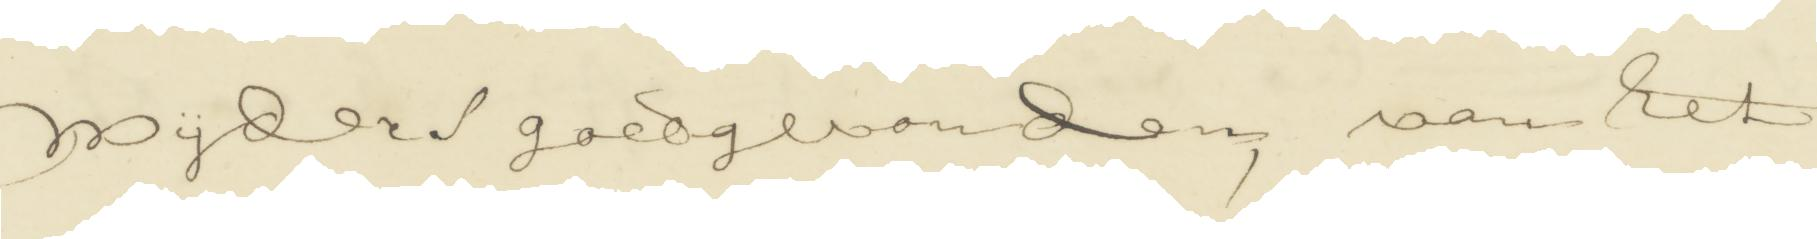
wijders goedgevonden, van het
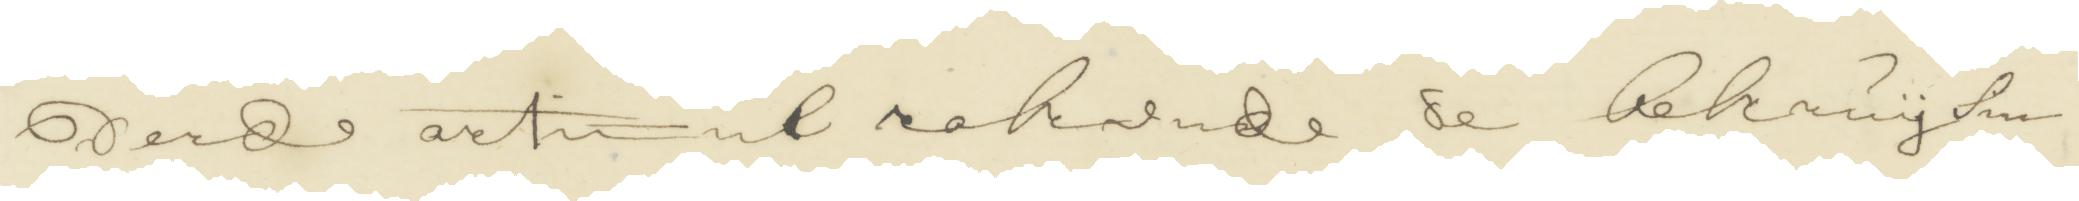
derde articul rakende de bekruijsin„
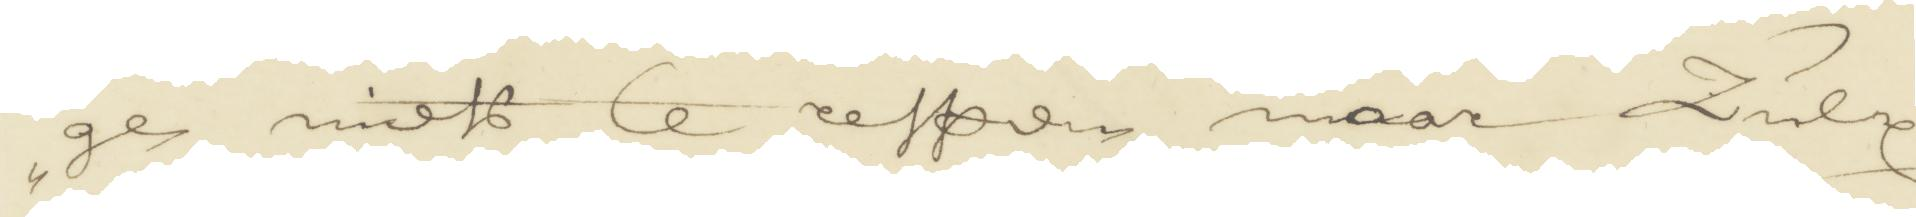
„ge, niets te reppen, maar zulx
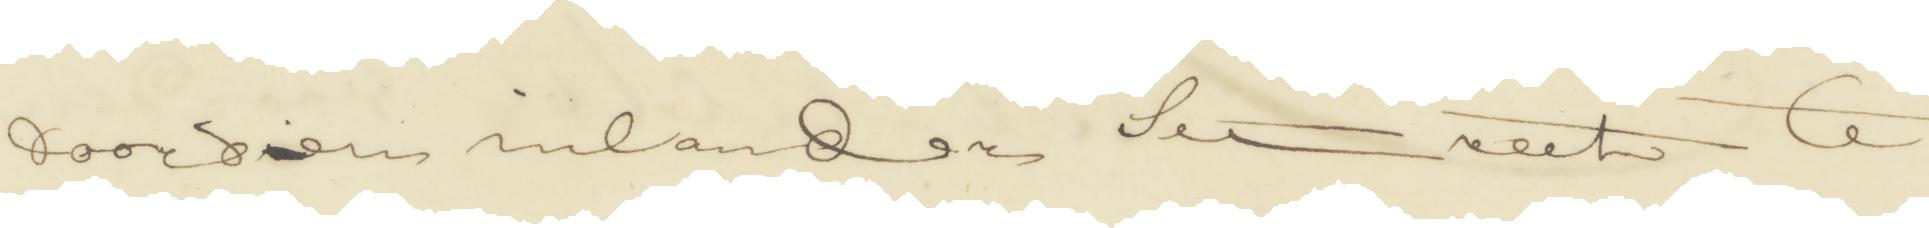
doordien inlander secreet te
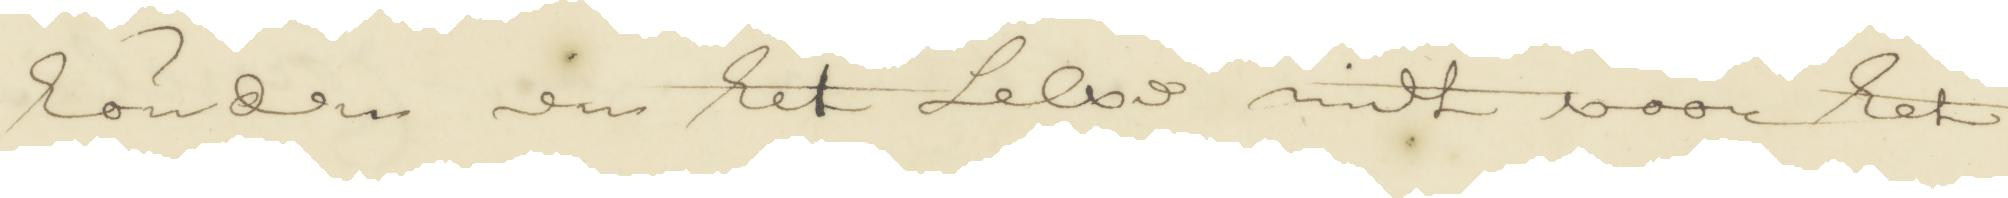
houden en het selve niet voor het
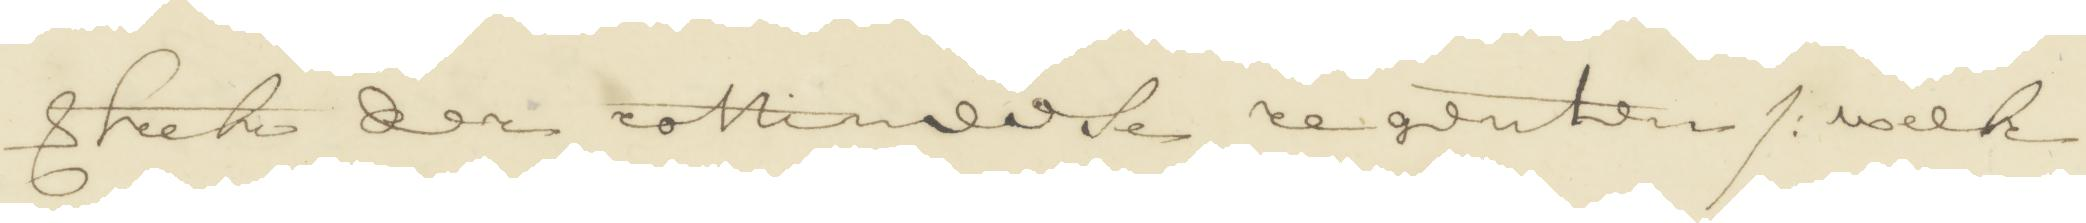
vertrek der rottineese regenten /:welk
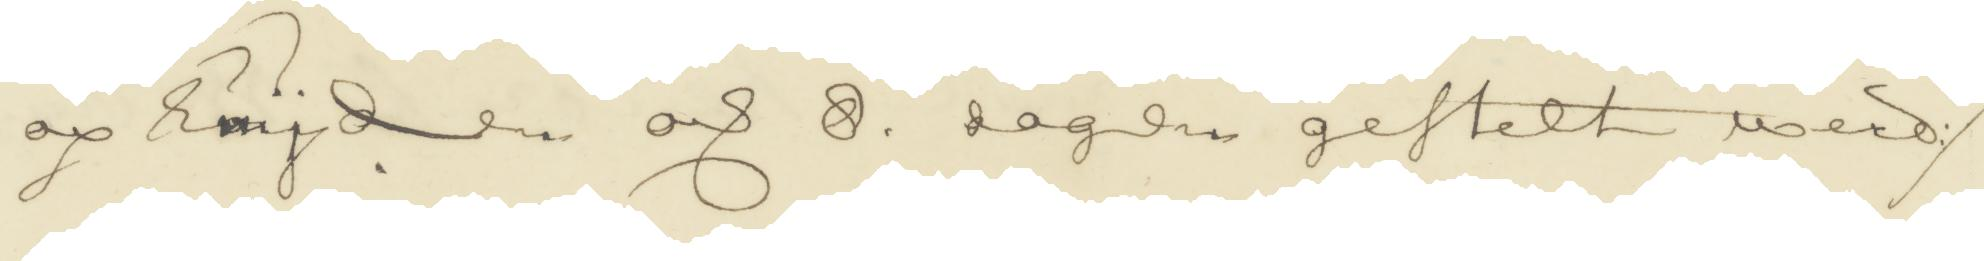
op huijden over 8. dagen gestelt werd:/
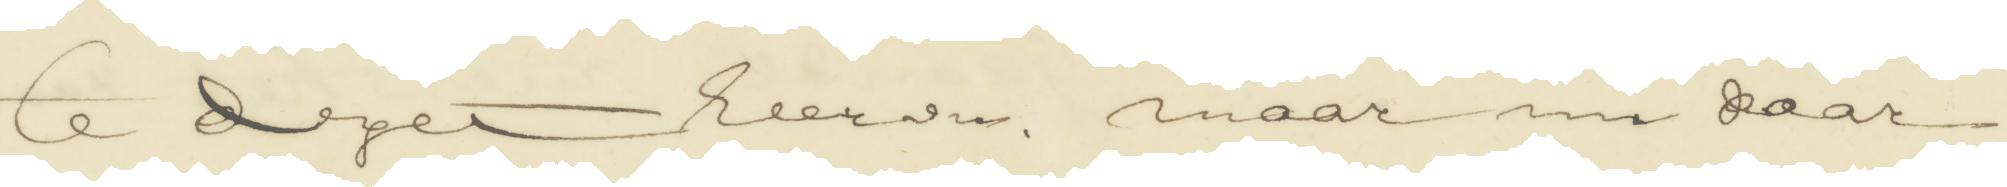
te depecheeren, maar nu daar
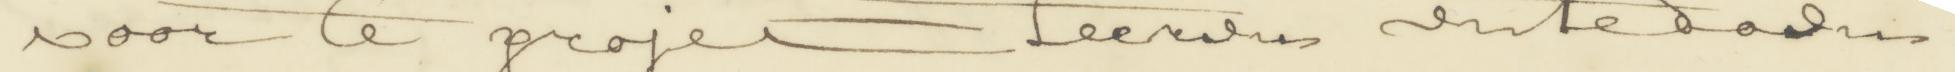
voor te projecteeren entedoen
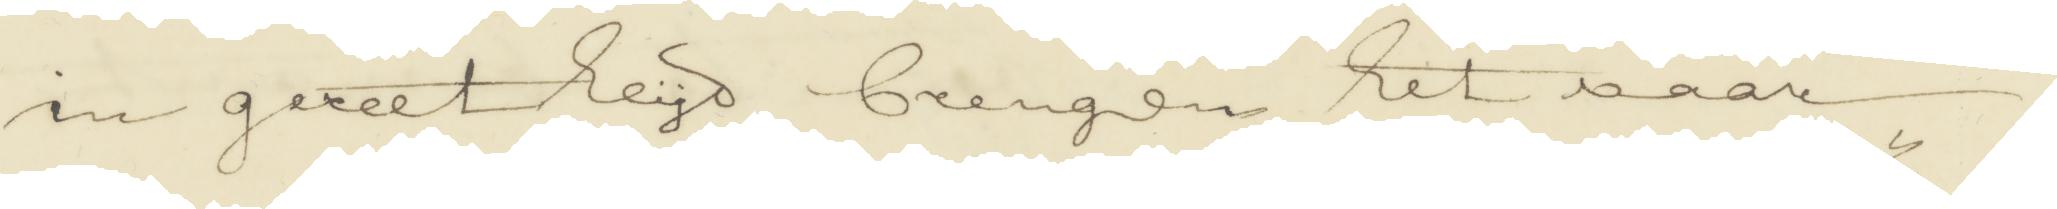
in gereetheijd brengen het vaar„
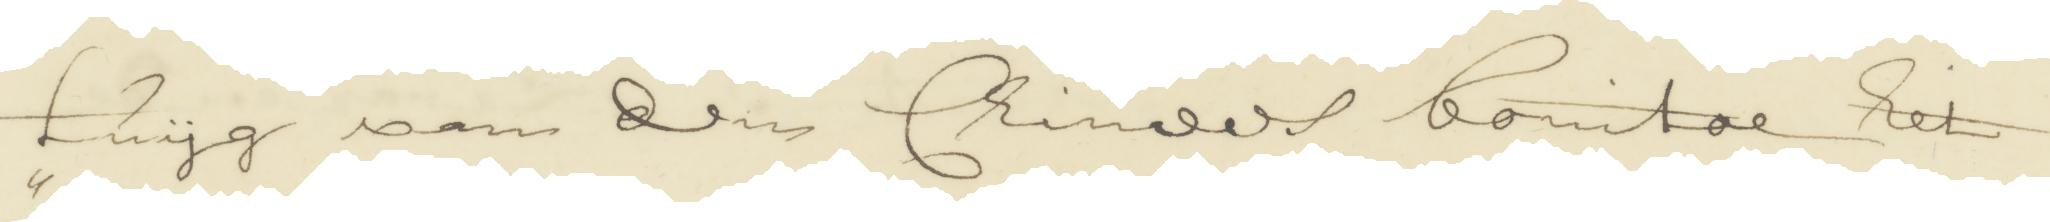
„tuijg van den Chinees bonitoe, het
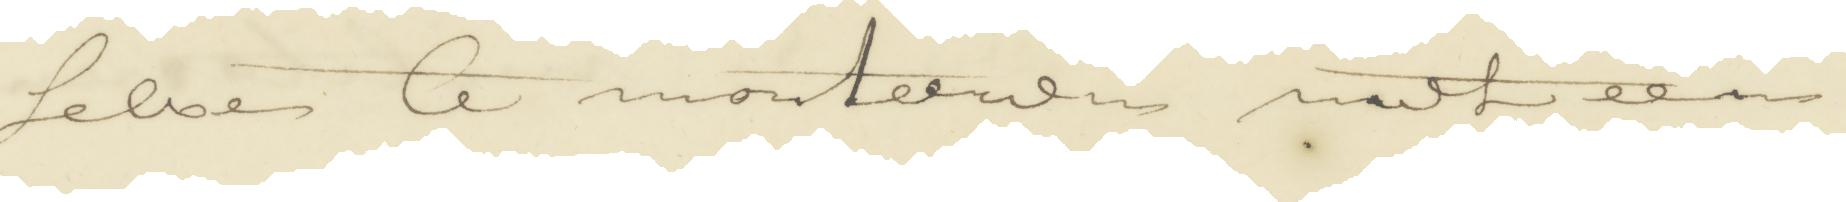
selve te monteeren met een
